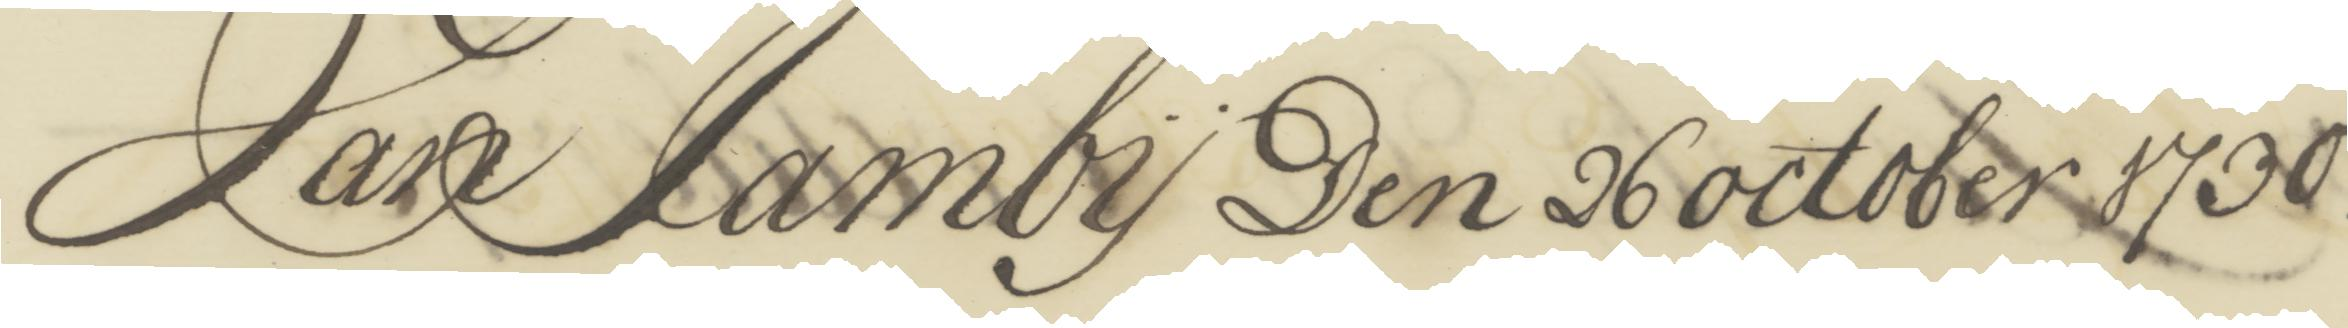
Van Jambij Den 26 october 1730.
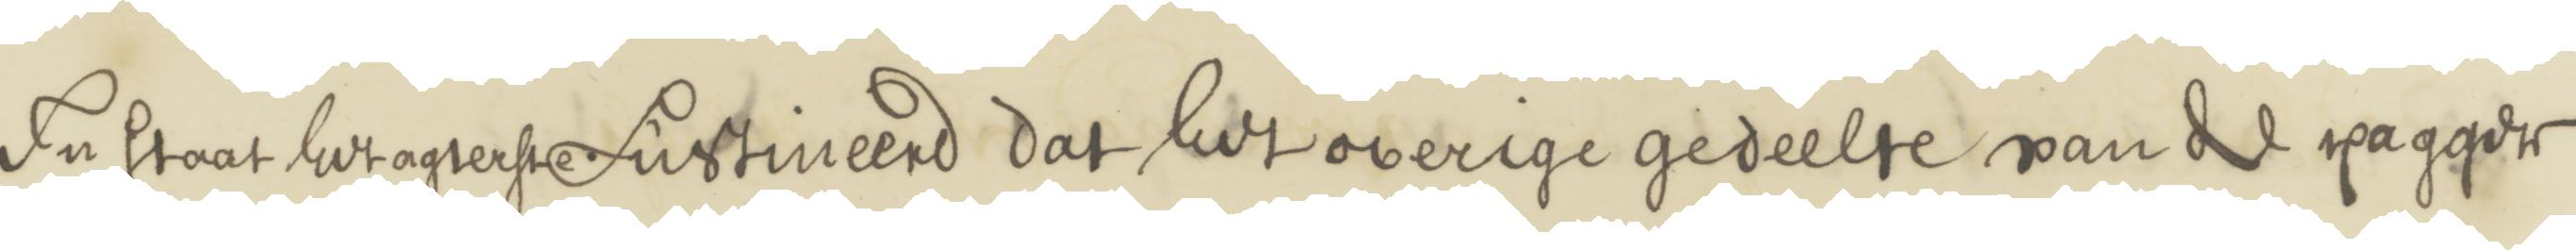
In staat het agterste Sustineerd dat het overige gedeelte van de pagger
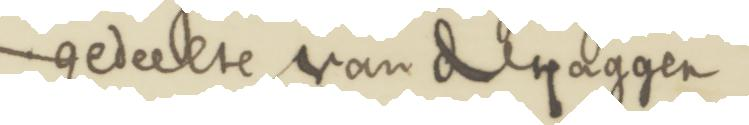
gedeelte van de pagger
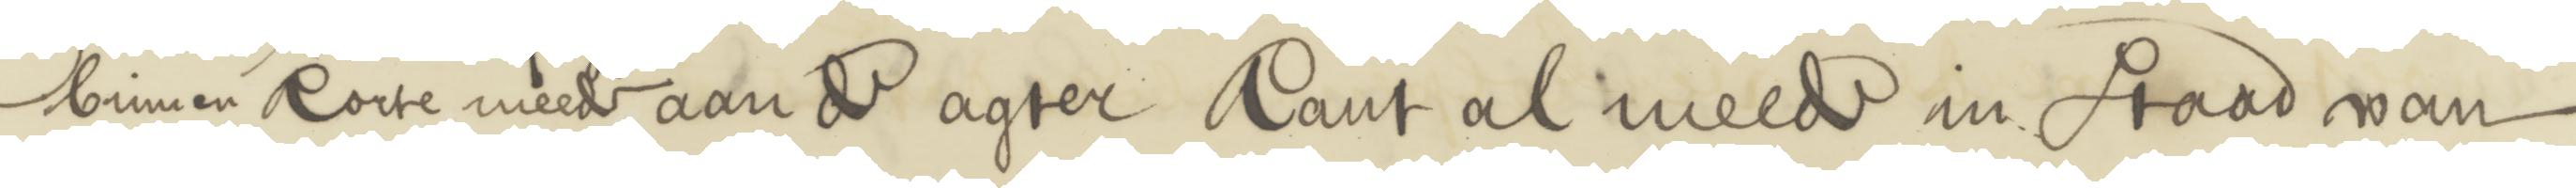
binnen Corte meede aan de agter Cant al meede in staad van
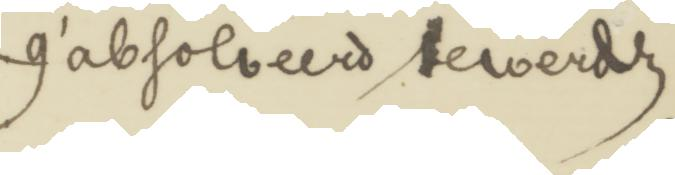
g’absolveerd te werden
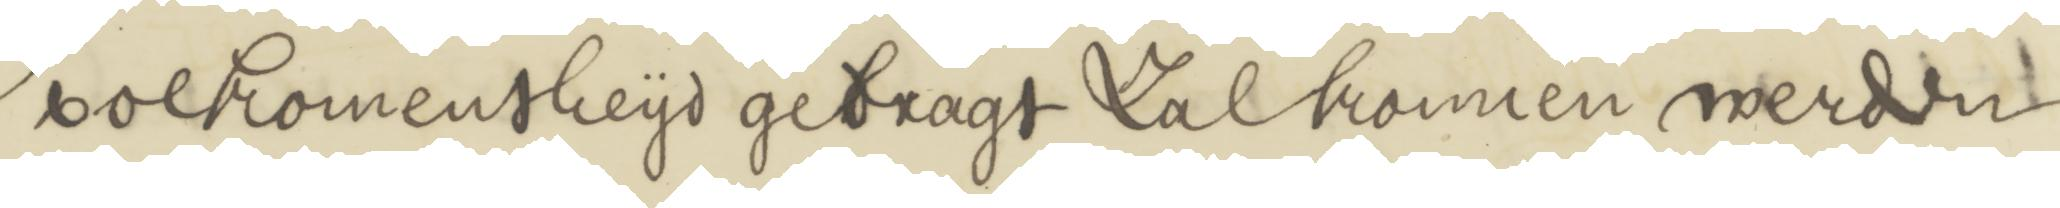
volkomentheijd gebragt zal konnen werden
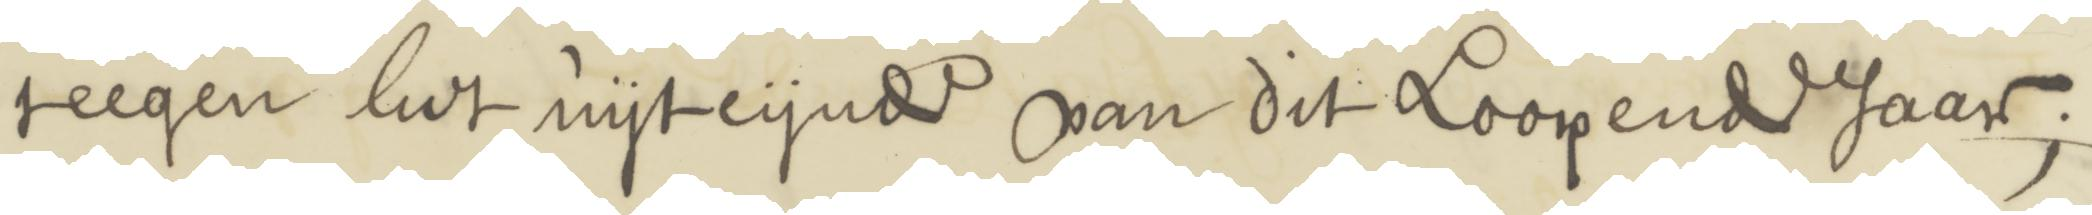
teegen het uijteijnde van dit Loopende jaar;
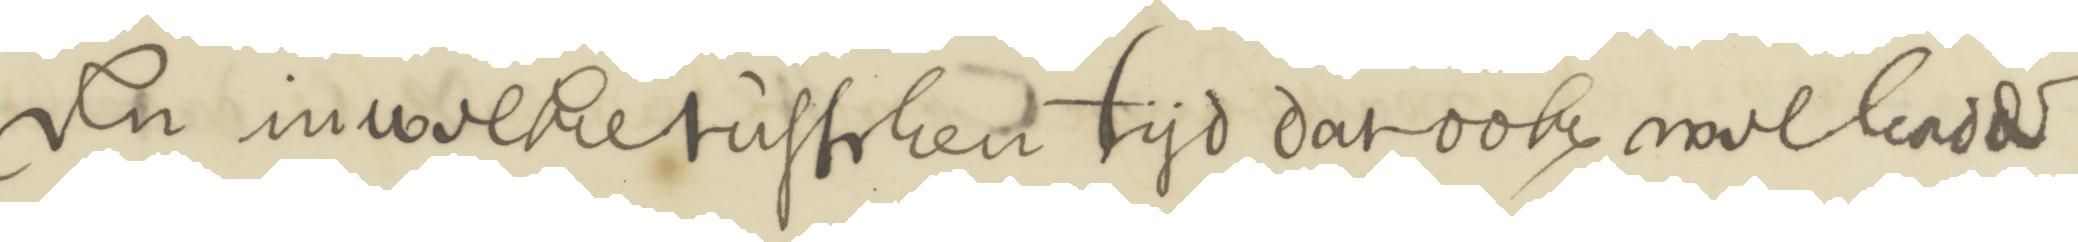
van inwelke tusschen tijd dat ook wel hadde
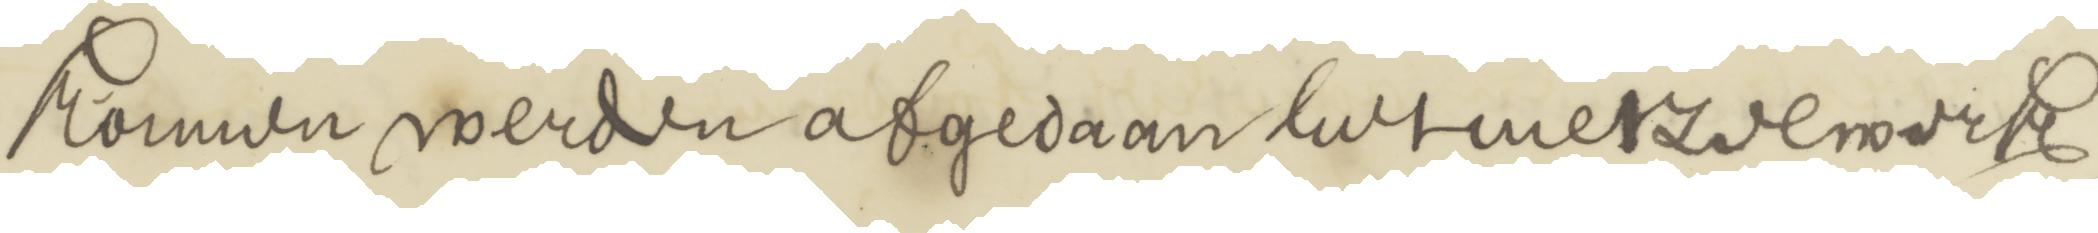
konnen werden afgedaan het metzelwerk
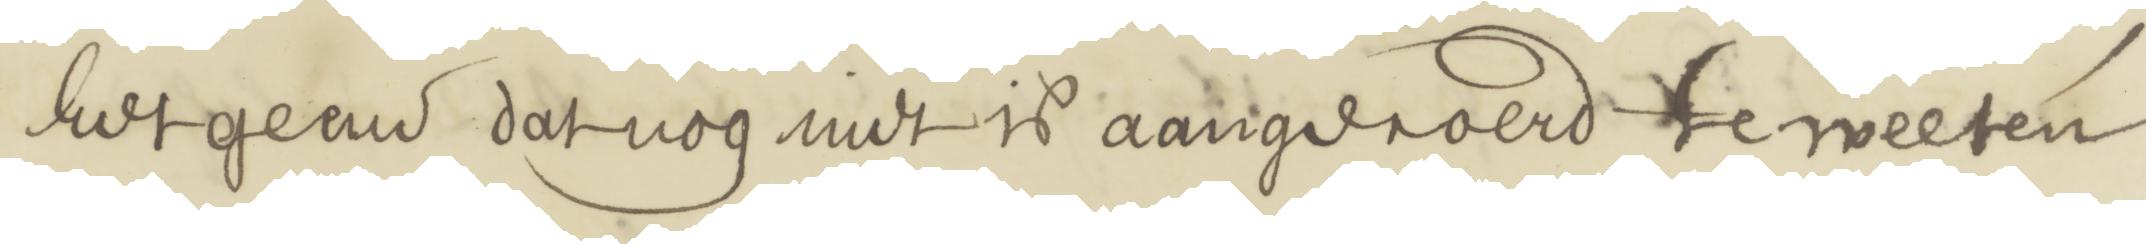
hetgeene dat nog niet is aangeroerd te weeten
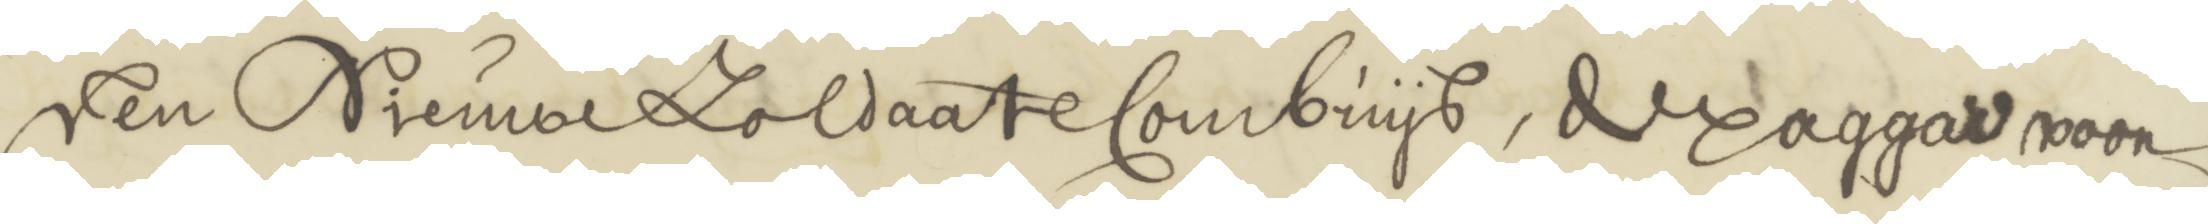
een Nieuwe Zoldaate Combuijs, depaggar voor
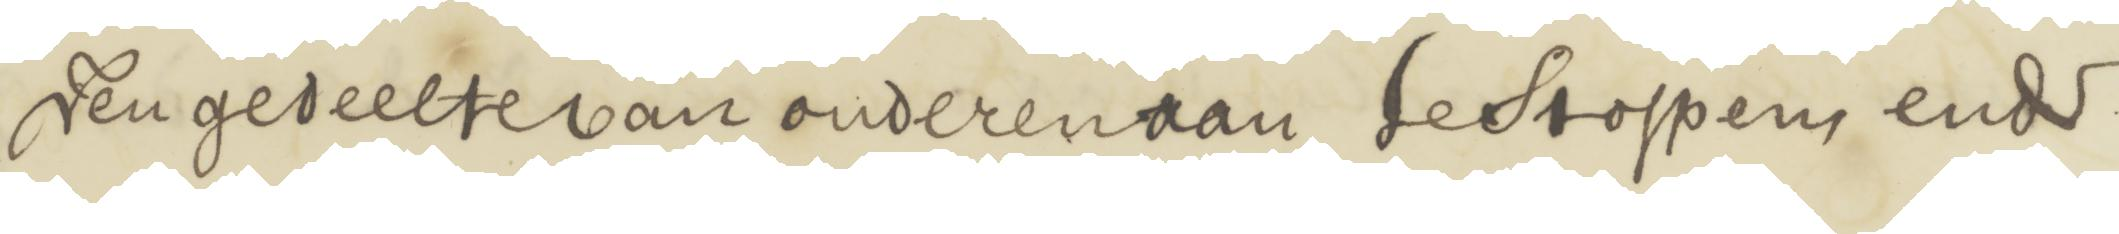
een gedeelte van onderen aan te stoppen ende
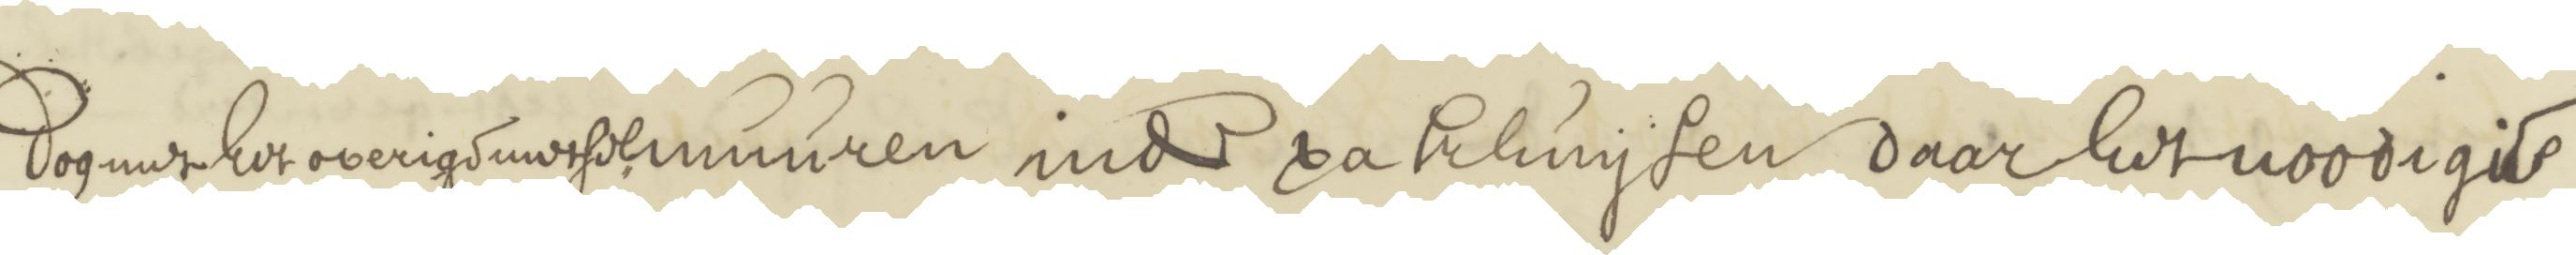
Dog met het overige metsel„ muuren inde pakhuijsen daar het noodigie
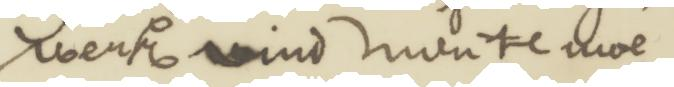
werk vind men te moe
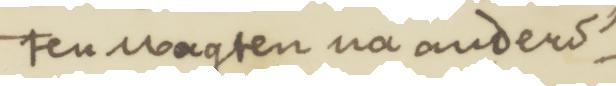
ten wagten na andere
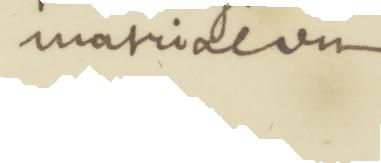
matrialen
